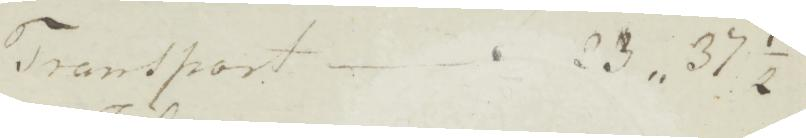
Transport ƒ 23„37 ½
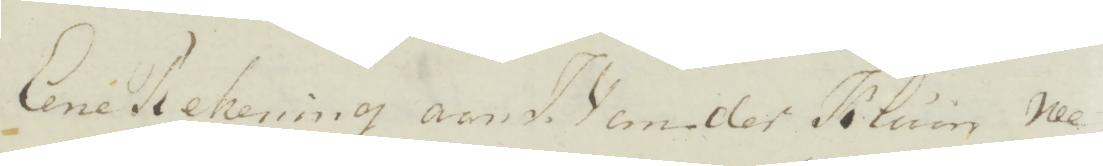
Eene Rekening aan I. Van der Kluin we
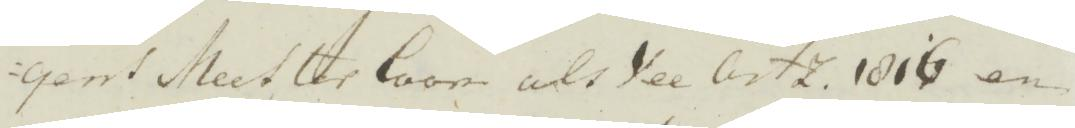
=gens Meesterloon als Vee Artz. 1816 en
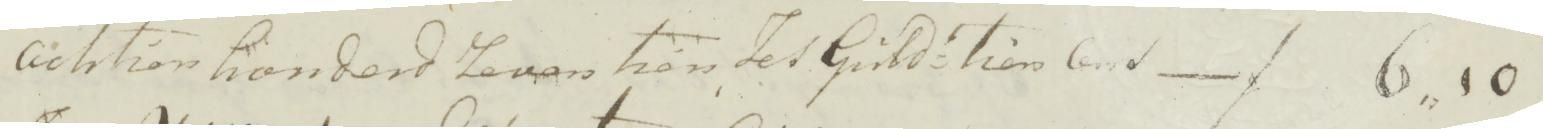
achtien honderd Zeventien Zes Guld=s tien Cents — ƒ 6„10
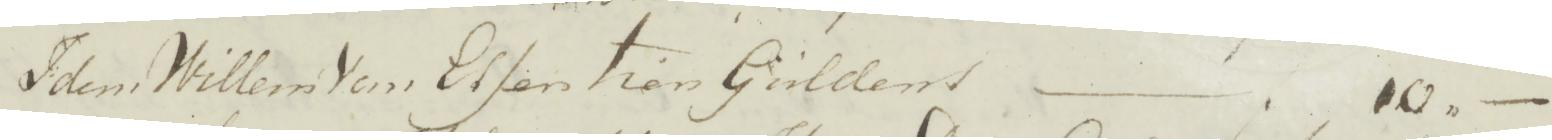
Idem Willem Van Essen tien Guldens — ƒ 10„ —
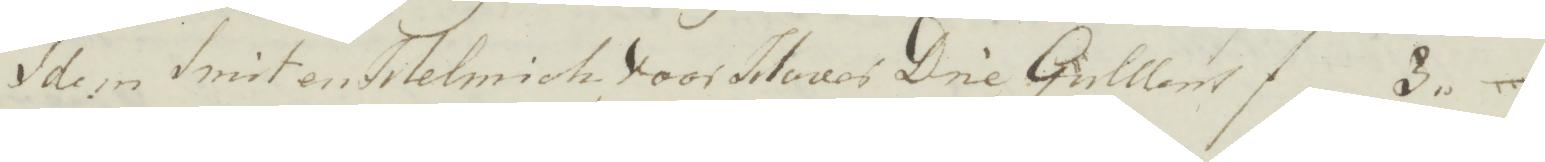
Idem Smit en Helmich Voor Hoves Drie Guldens ƒ 3„ —
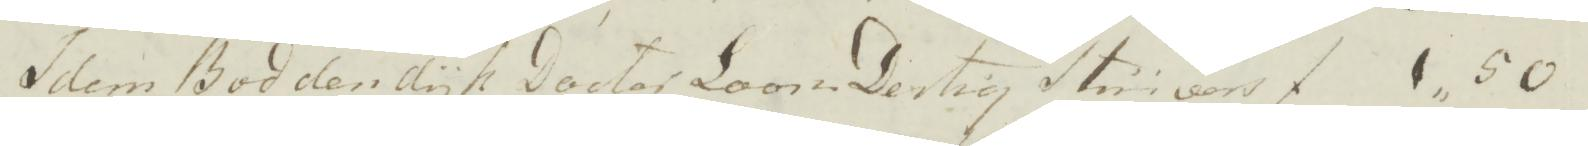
Idem Boddendijk Doctor Loon Dertig Stuivers ƒ 1„50
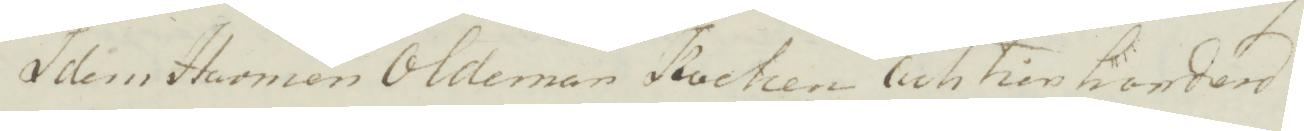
Idem Harmen Oldeman Koceen achtien honderd
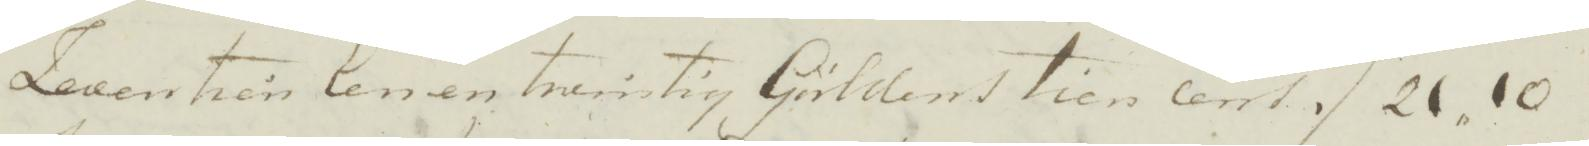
Zeventien Een en twintig Guldens tien cent ƒ 21„10
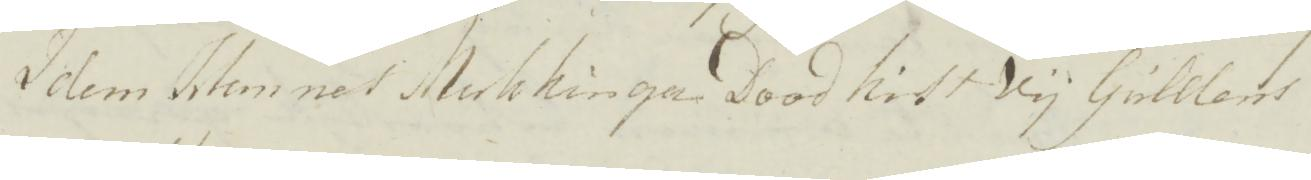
Idem Hannes Makkinga Dood Kist vij Guldens
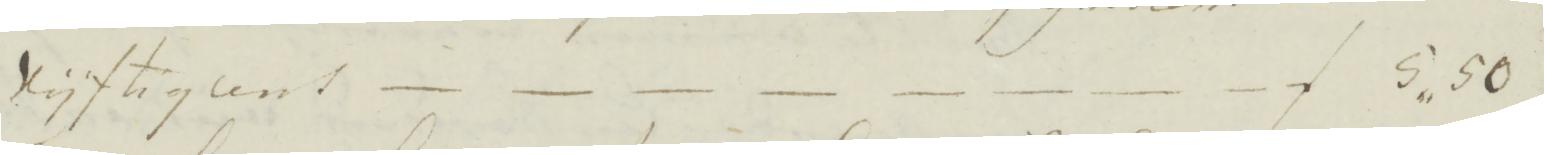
Vijftig Cents — — — — — — — — ƒ 5„50
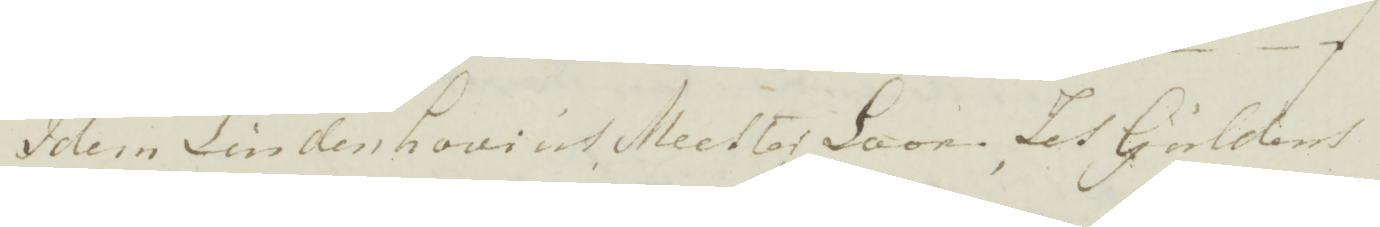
Idem Lindenhovius Meester Loon, Zes Guldens
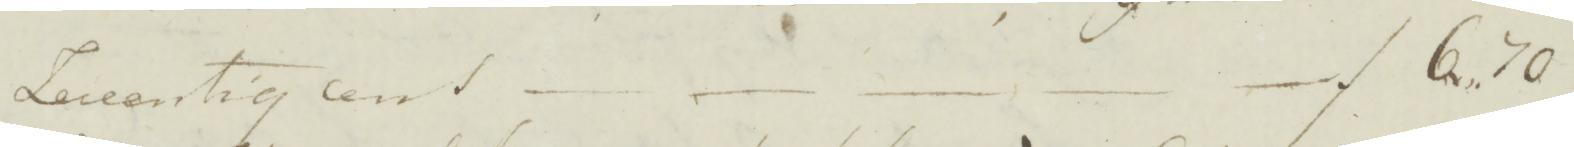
Zeventig Cent — — — — — — — ƒ 6„70
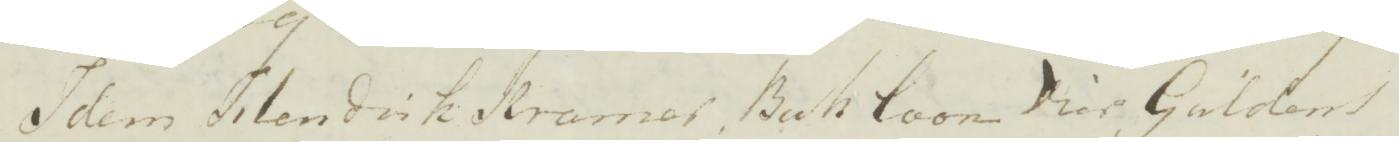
Idem Hendrik Kramer, Bak loon Vier Guldens
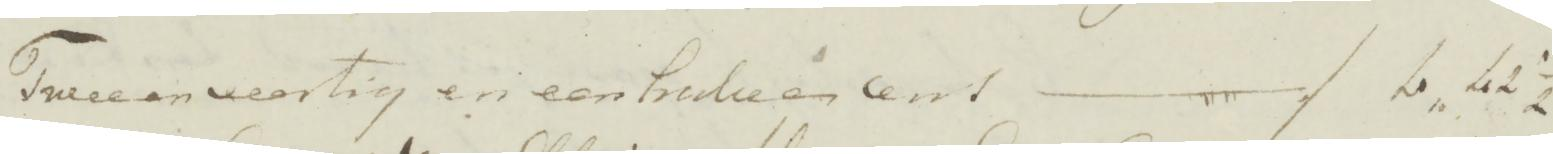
Twee en veertig en een halven Cent — — ƒ 2„42 ½
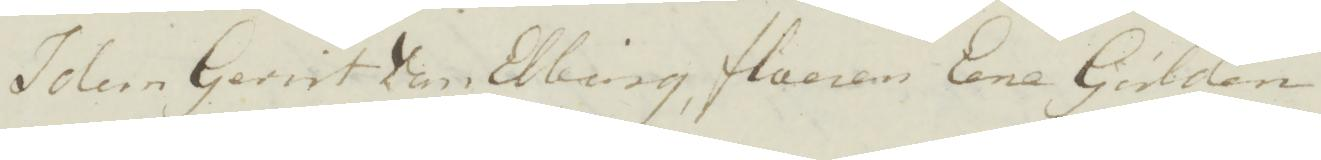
Idem Gerrit van Elbing, floeren Eene Gulden
